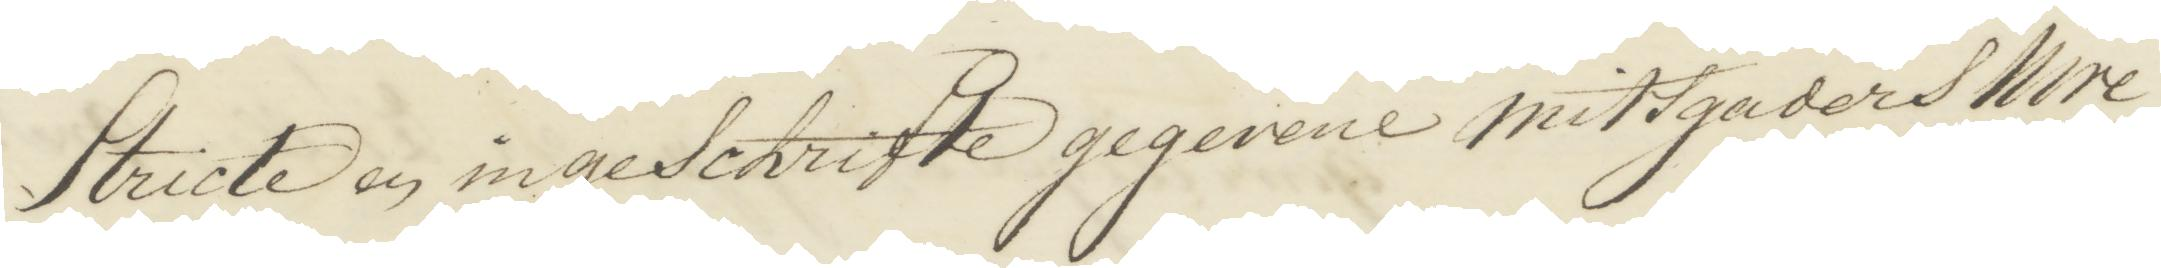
stricte en ingeschrifte gegevene mitsgaders Uwe
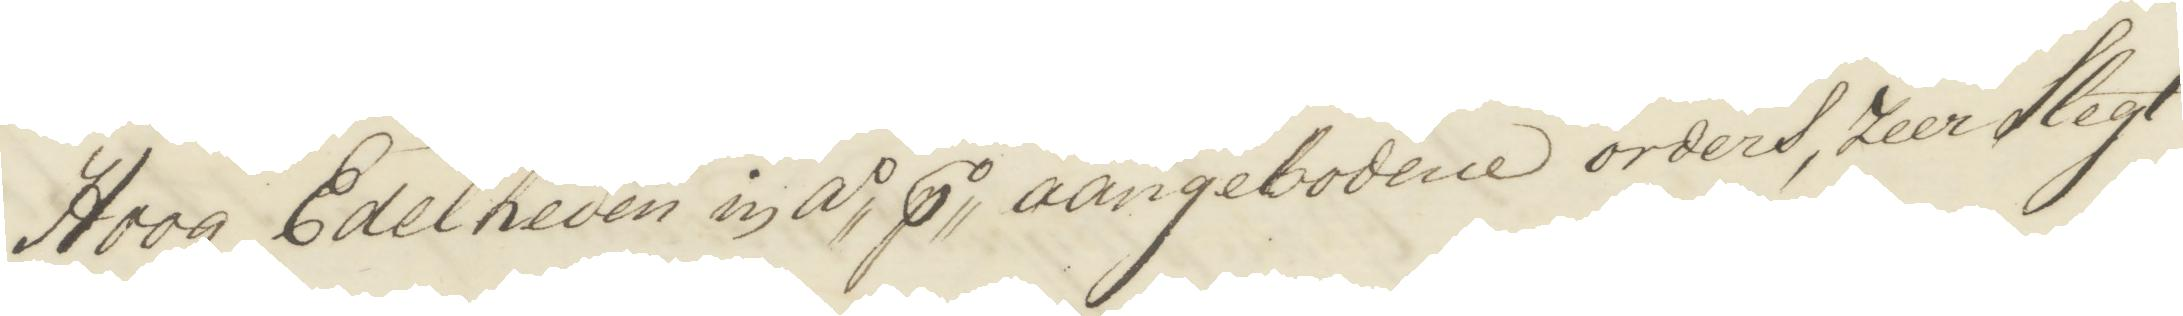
Hoog Edelheden in a„o p„o aangebodene orders, zeer slegt
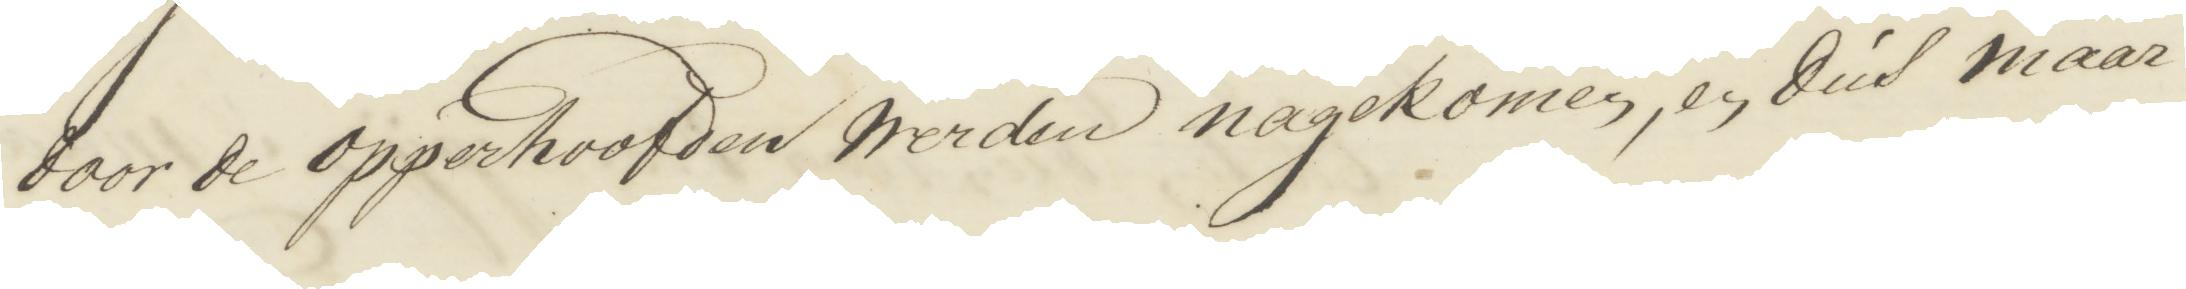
door de opperhoofden werden nagekomen, en dus maar
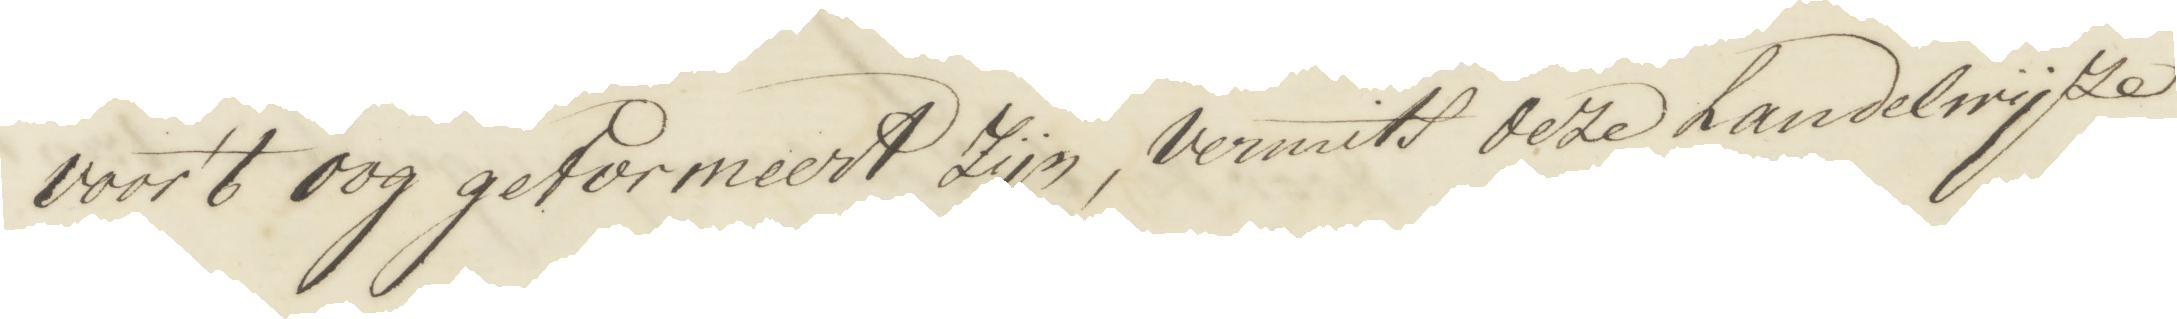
voor’t oog geformeert zijn, vermits deze handelwijze
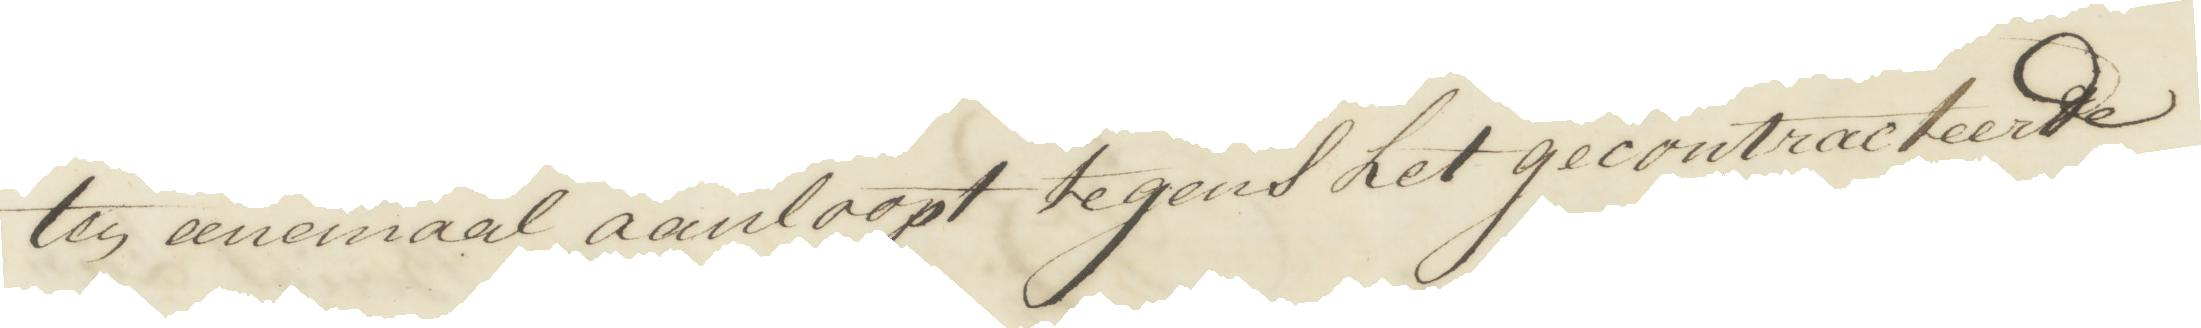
ten eenemaal aanloopt tegens het gecontracteerde
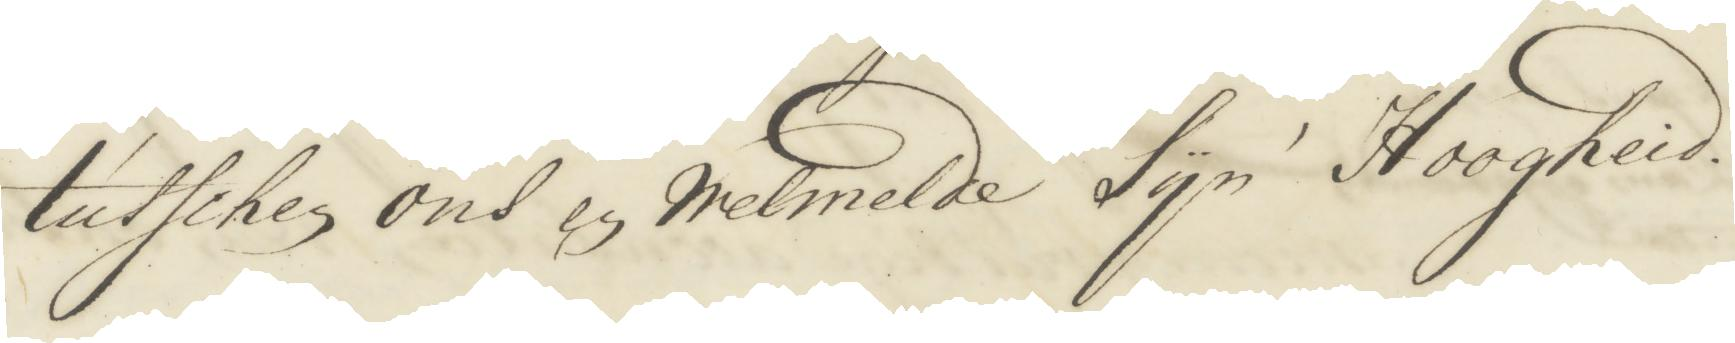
tusschen ons en welmelde sijn ' Hoogheid.
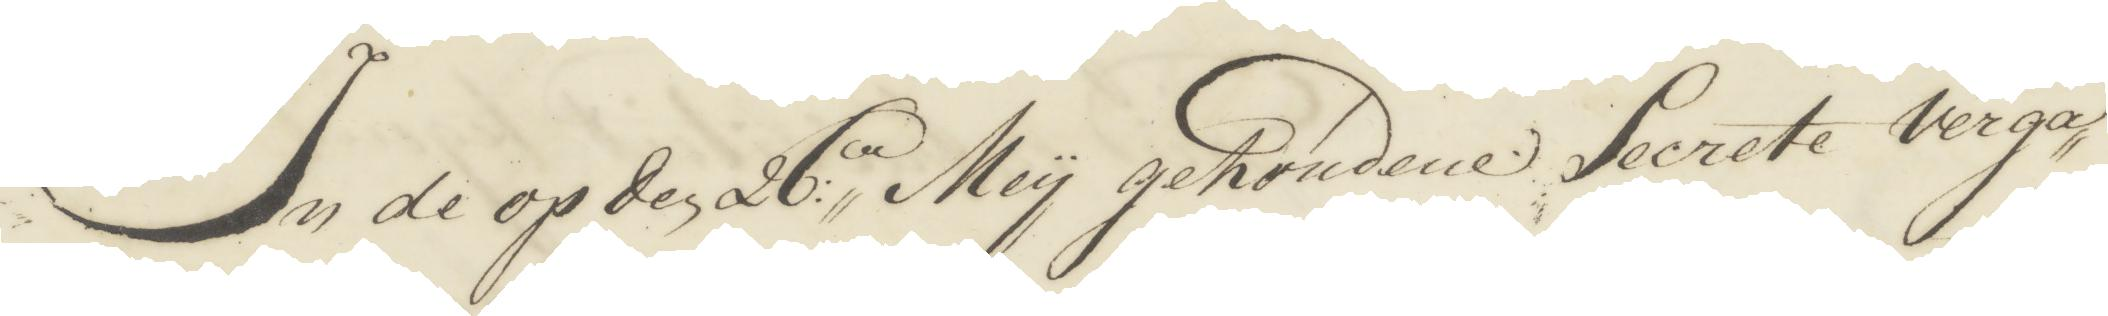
In de op den 26:„e Meij gehoudene secrete verga„
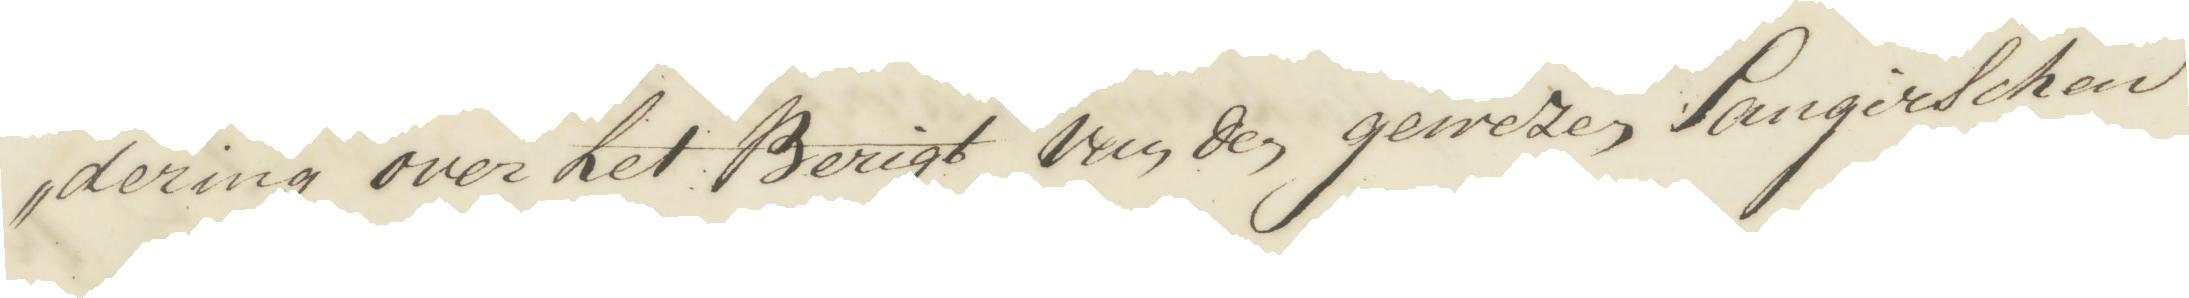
„dering over het Berigt van den gewezen sangirschen
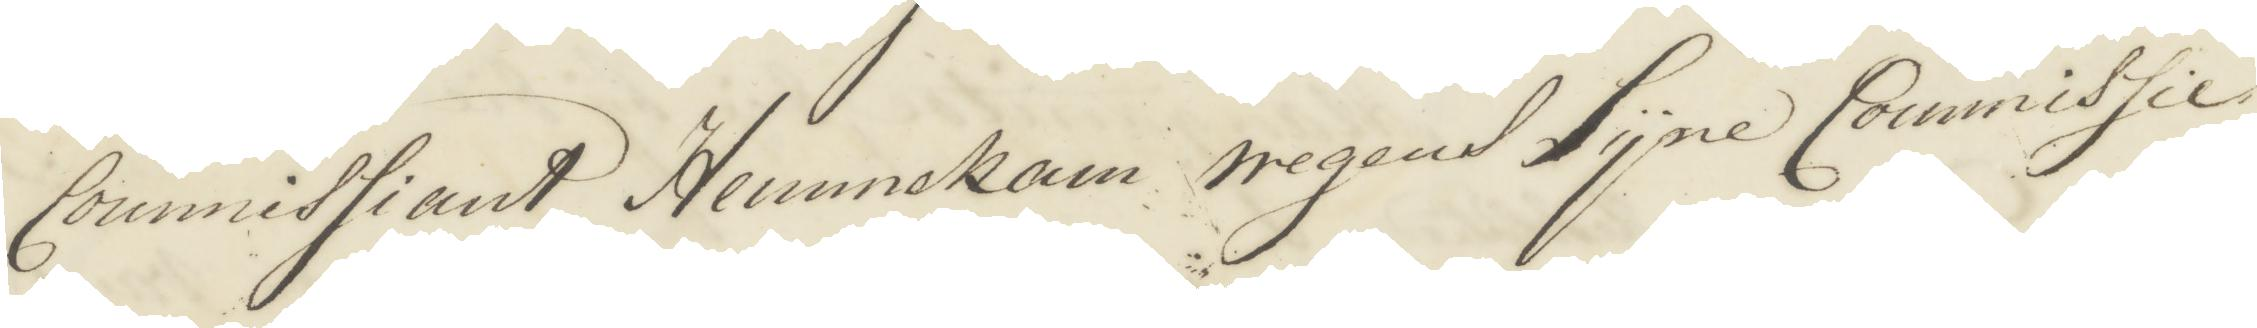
Commissiant Hemmekam wegens sijne commissie
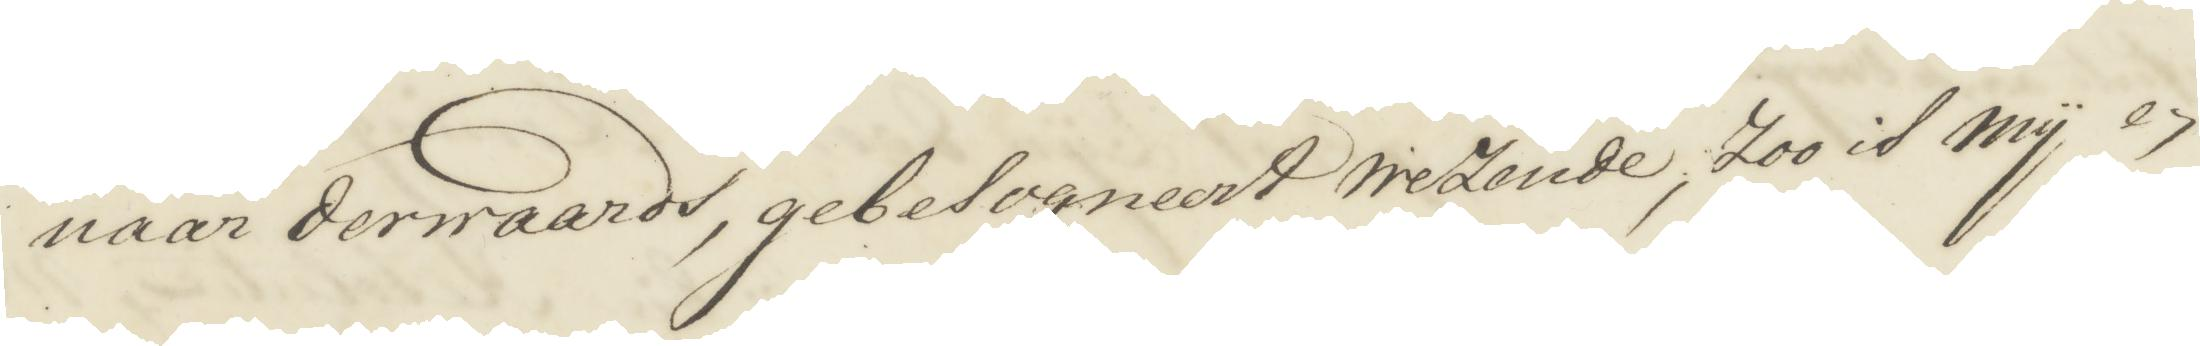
naar derwaards, gebesogneert wezende, zoo is mij en
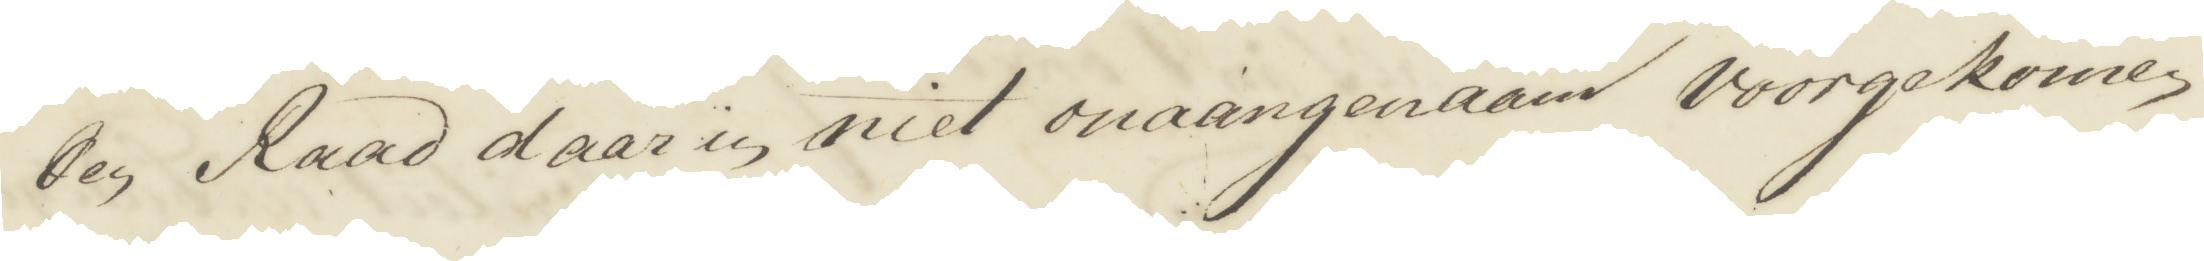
den Raad daar in niet onaangenaam voorgekomen
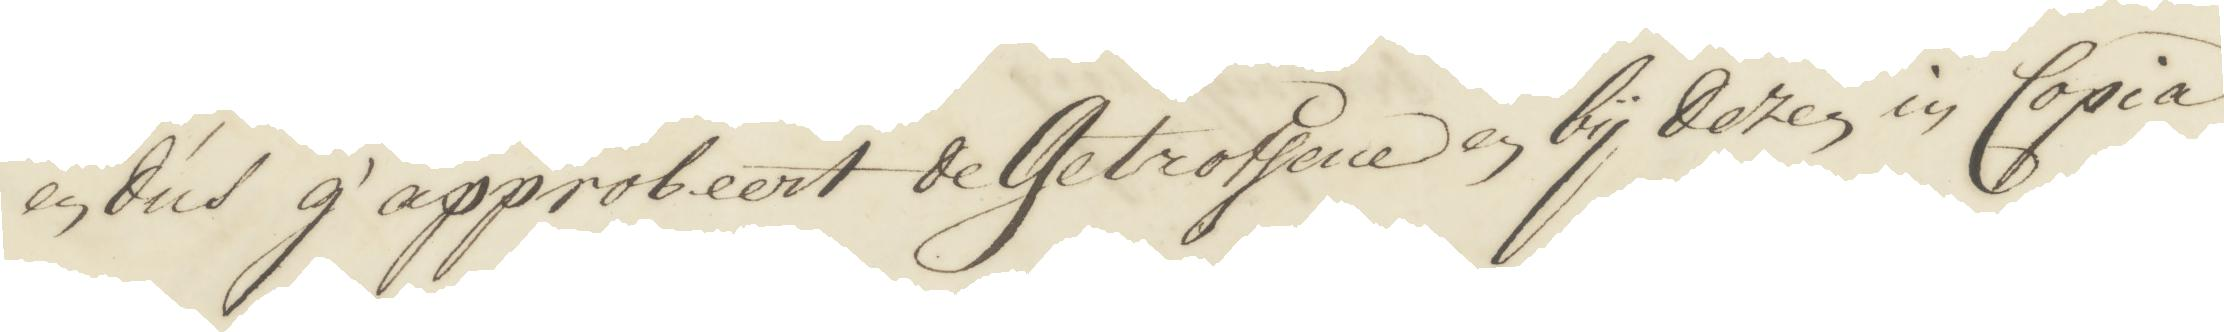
en dus g’approbeert de Getroffene en bij dezen in Copia
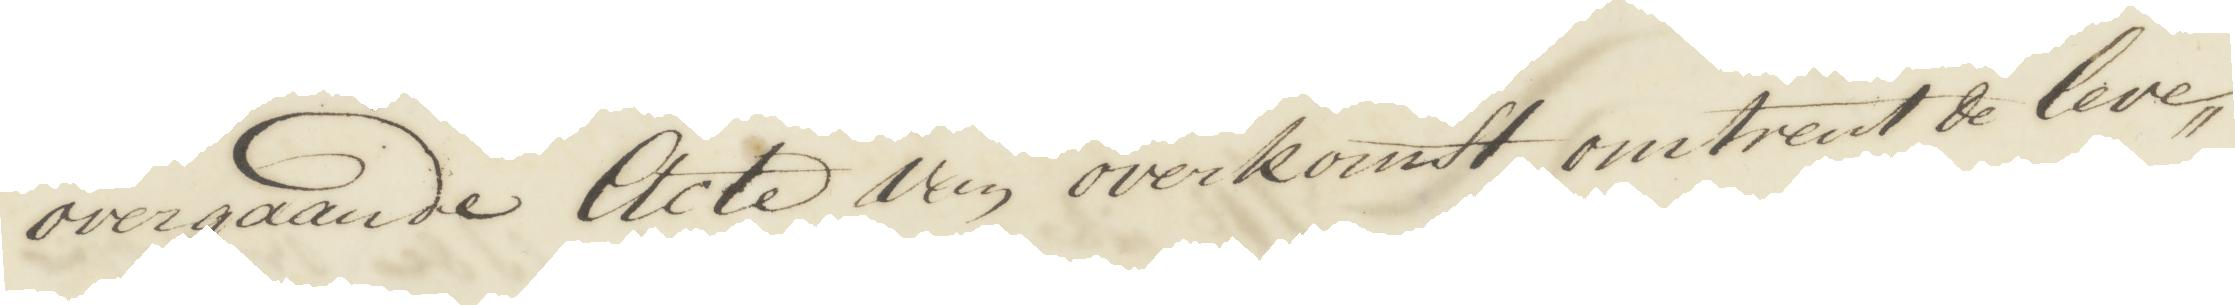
overgaande Acte van overkomst, omtrent de leve„
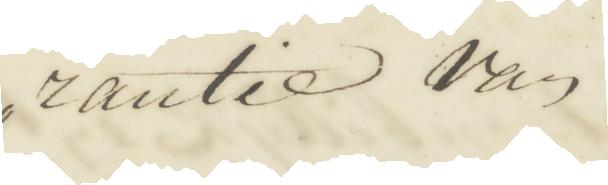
rantie van
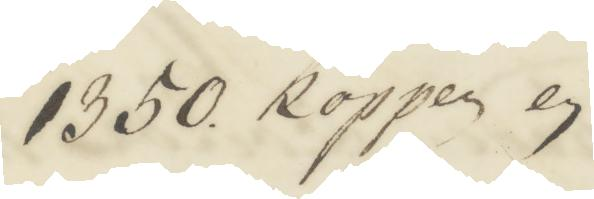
1350. koppen en
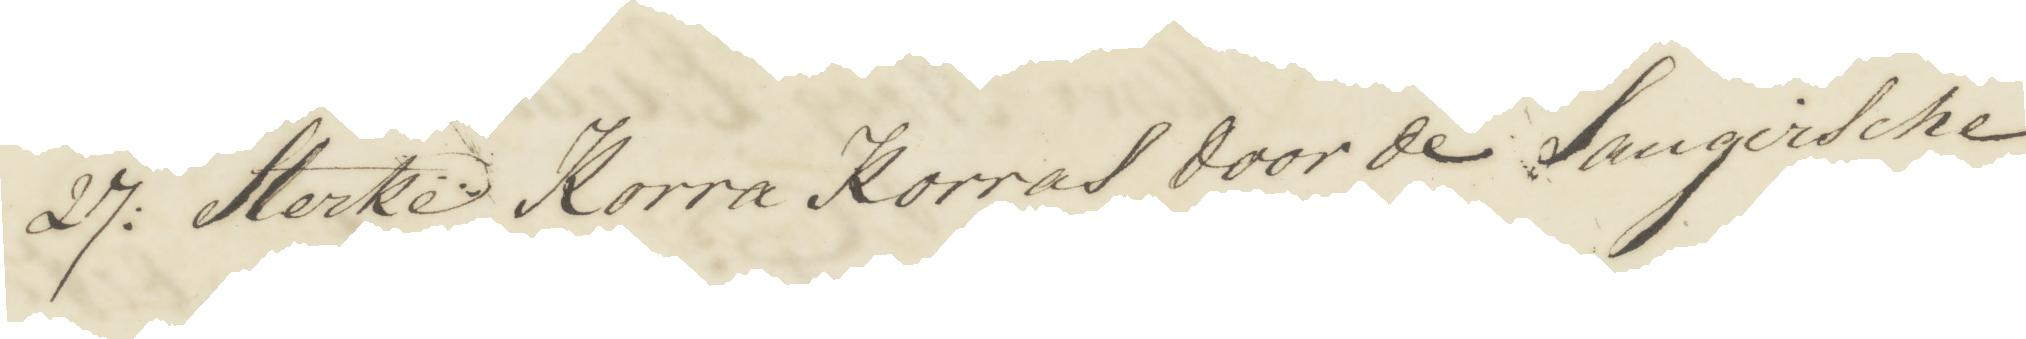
27: sterke Korra Korras door de sangirsche
